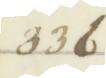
936
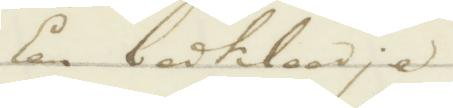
Een boeklaadje
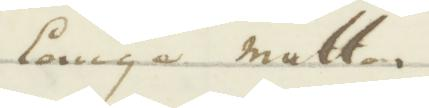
Eenige matten
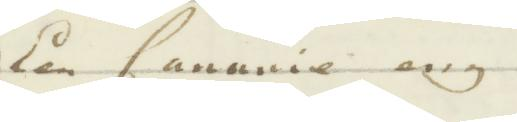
Een Canarie enz
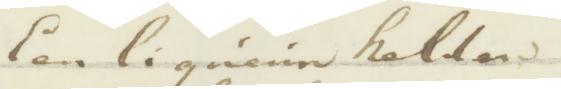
Een liqueur kist enz
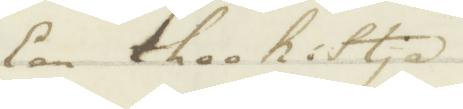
Een theekistje
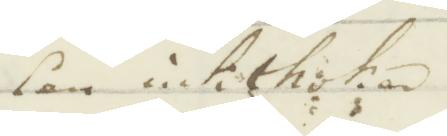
Een inktkoker
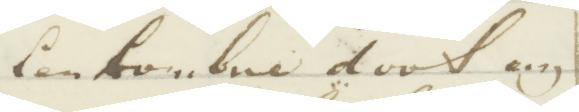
Een bamboe doos enz
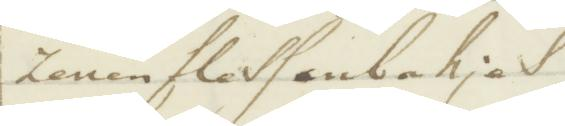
zeven flessenbakjes
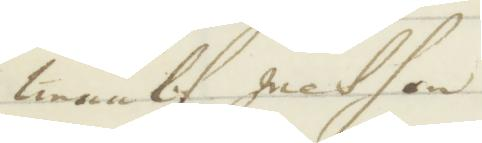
twaalf messen
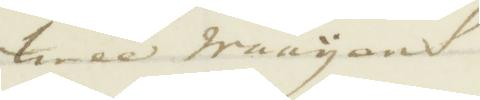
twee Waaijers
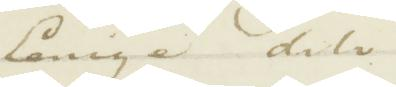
Eenige dito.
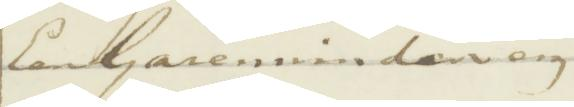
Een Garenvinder enz
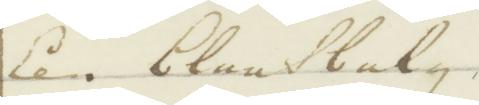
Een blaasbalg
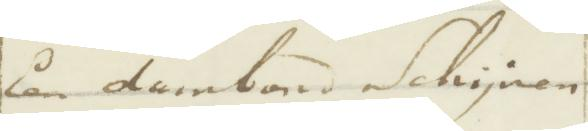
Een dambord schijven
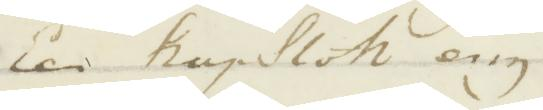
Een kapstok enz
